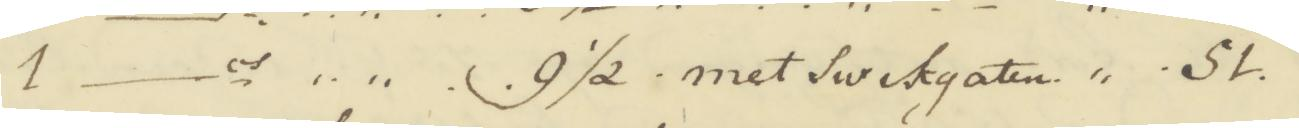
1 d=os . .„ . . 9½ . met swikgaten. „ .51.
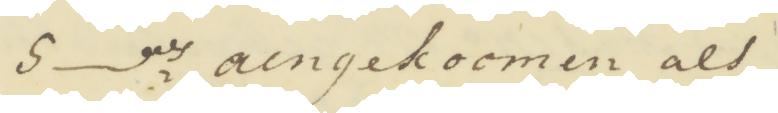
5 d=os aengekoomen als
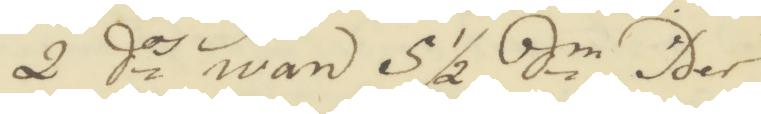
2 d=os wan 5½ d=m Ider
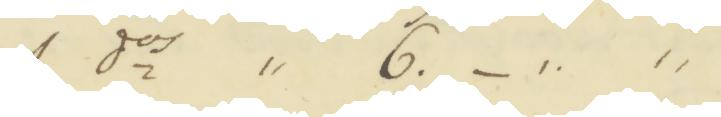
1 d=os „ 6. – „ „
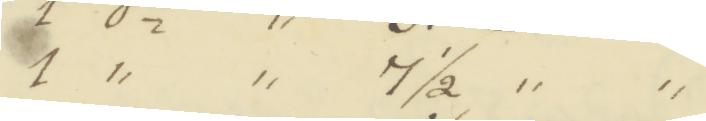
1 „ „ 7½ „ „
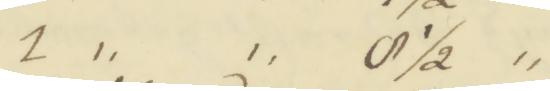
1 „ „ 8½ „
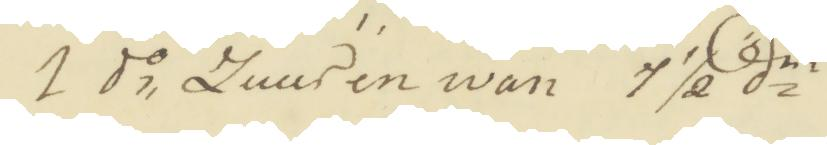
1 d„o Zuur en wan 7½ d=m
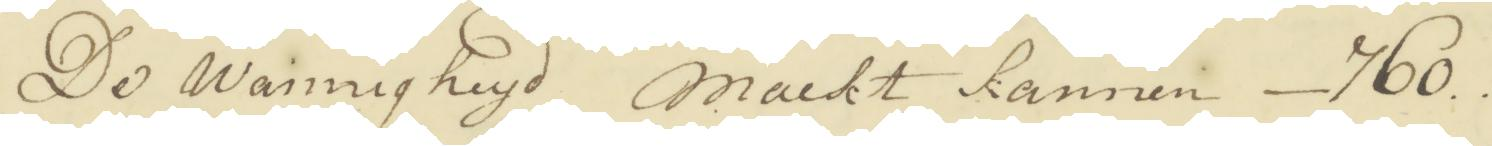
De wannigheijd maekt kannen — 760.
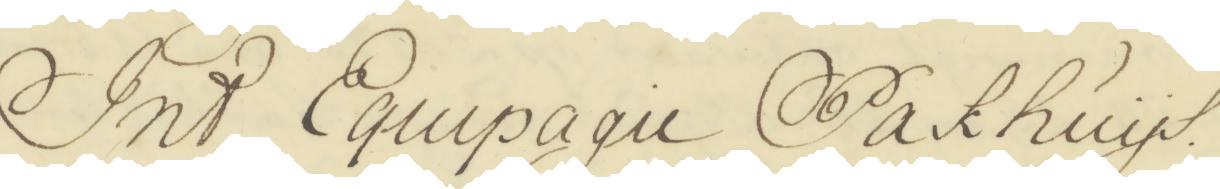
Int Equipagie Pakhuijs.
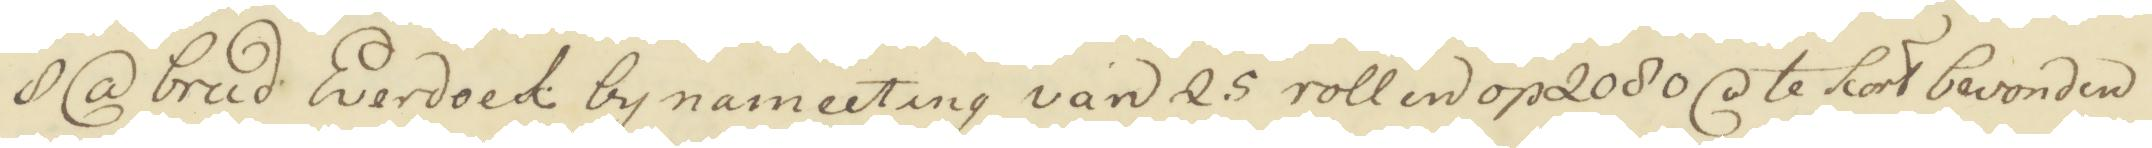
8 @ breed Everdoek bij nameeting van 2.5 rollen op 2080 @ te kort bevonden
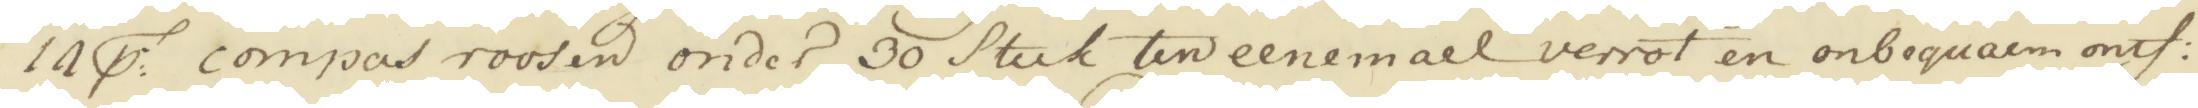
14p:s compas roosen onder 30 Stuk ten eenemael verrot en onbequaem ontf:
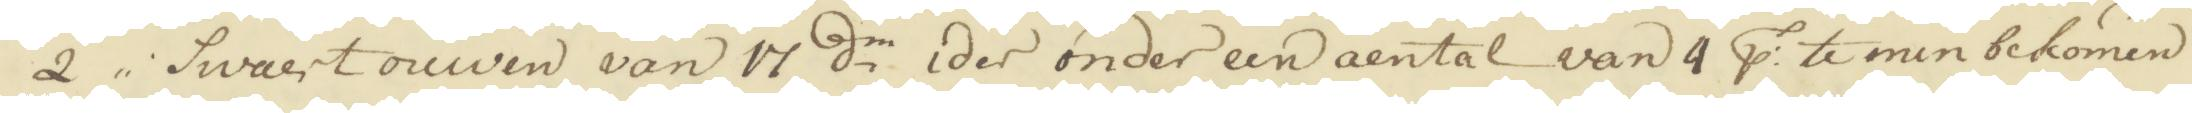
2 „ Swaertouwen van 17 d„m ider onder een aental van 4 p:s te min bekomen
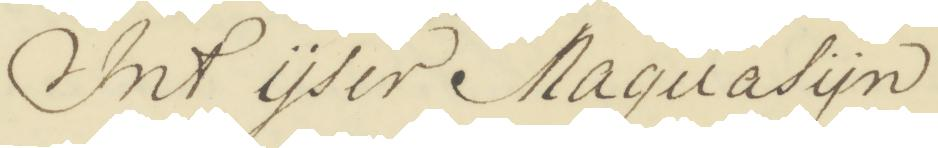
Int ijser Maguasijn
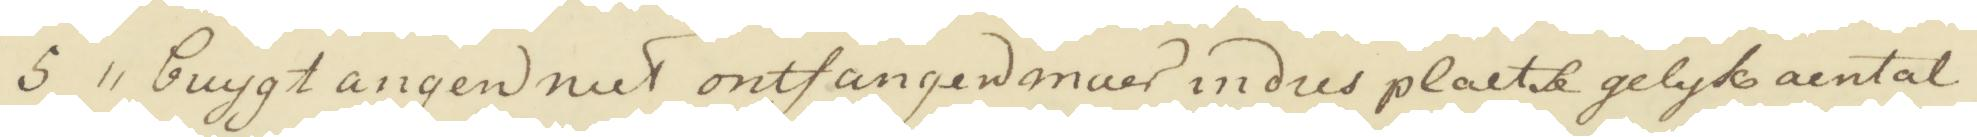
5 „ buygtangen niet ontfangen maer in dies plaetse gelyk aental
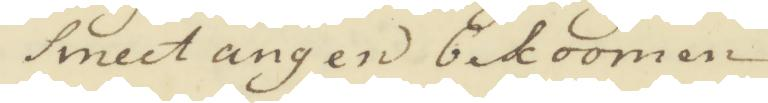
smeetangen bekoomen
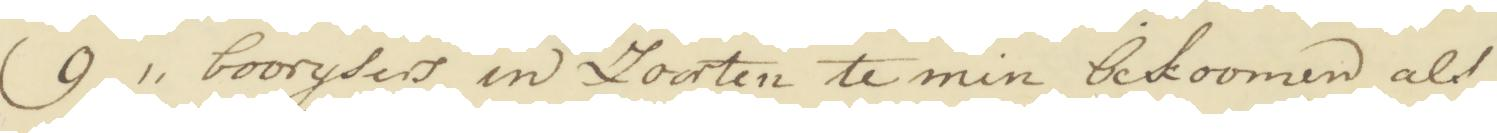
9 „ boorysers in Zoorten te min bekoomen als
